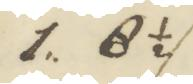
1„ 8½
